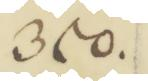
350.
